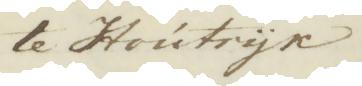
te Houtrijk
